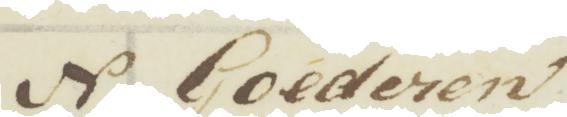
N Goederen
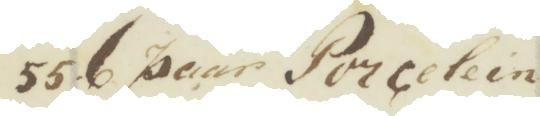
55. 6 paar Porcelein
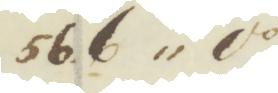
56. 6 „ d:o
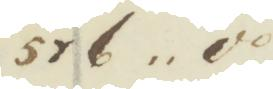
57 6 „ d:o
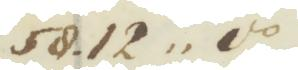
58.12 „ d:o
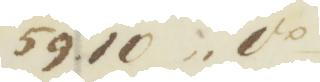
59. 10 „ d:o
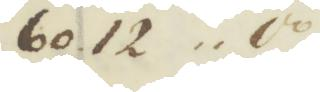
60. 12 „ d:o
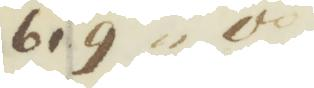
61. 9 „ d:o
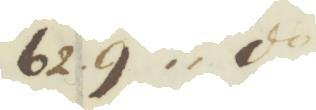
62.9 „ d:o
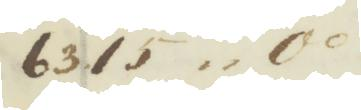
63. 15 .„ d:o
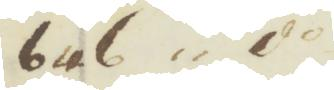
64. 6 „ d:o
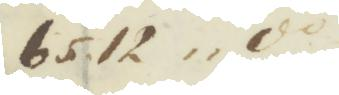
65.12 „ d:o
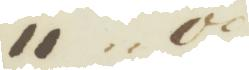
11 „ d.o
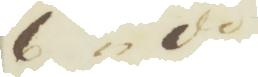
6 „ d:o
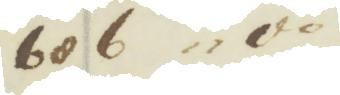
68 6 „ d:o
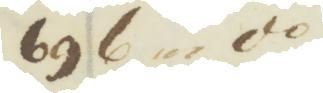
69 6 „„ d:o
